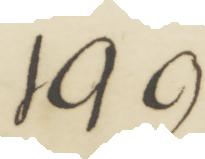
149.
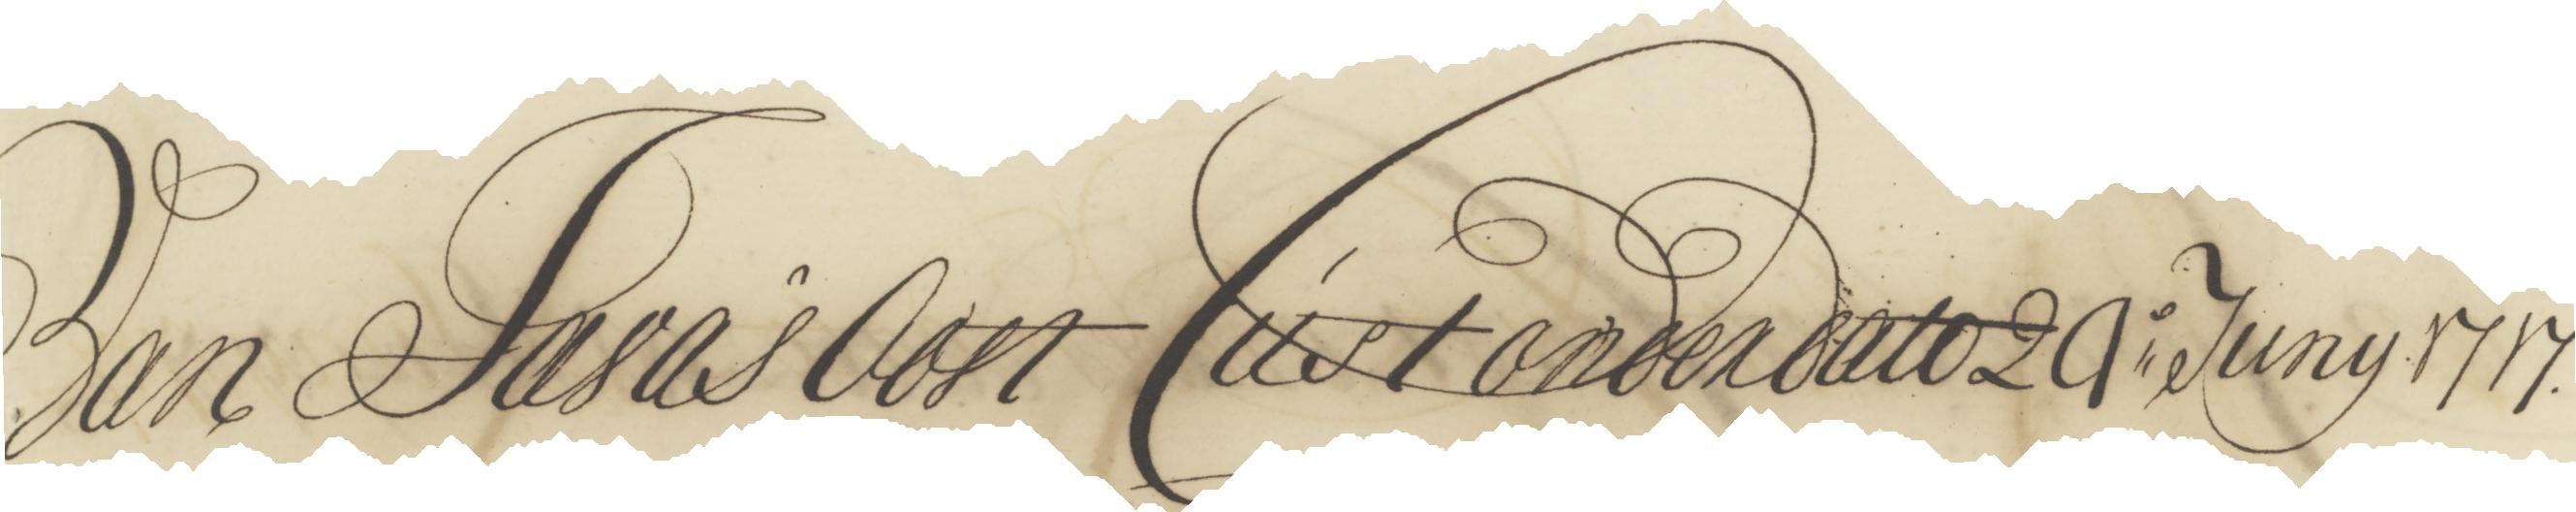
Van Java's Oost Cust onder dato 24„e Juny 1717.
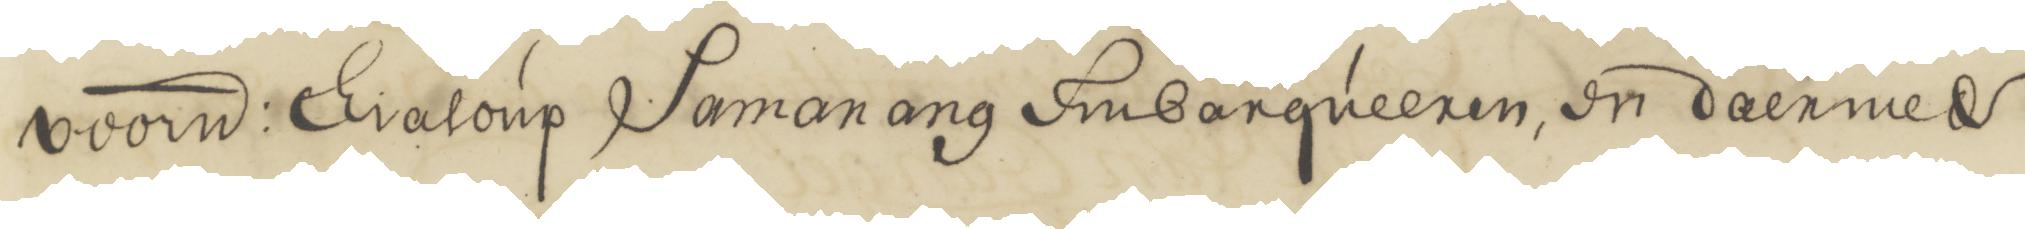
voorn: chialoup samanang Embarqueeren, en daermede
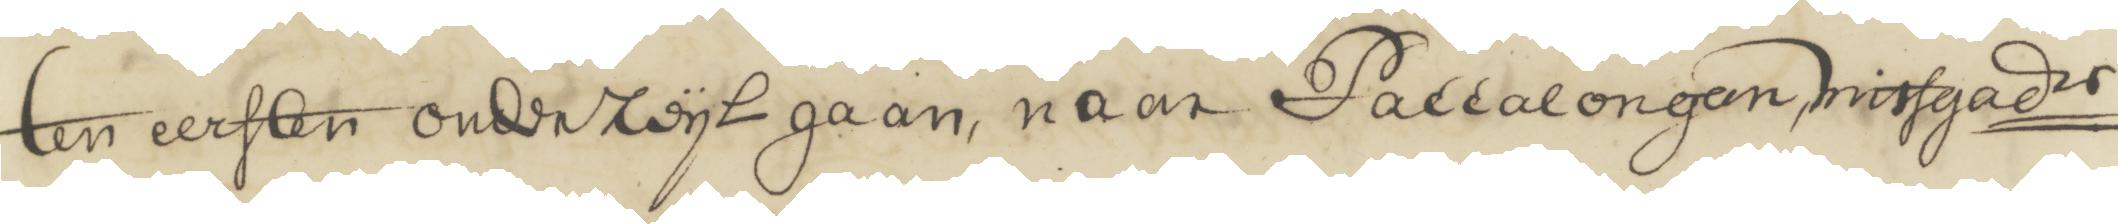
ten eersten onderzeijl gaan, naar Paccalongan, mitsgad=rs
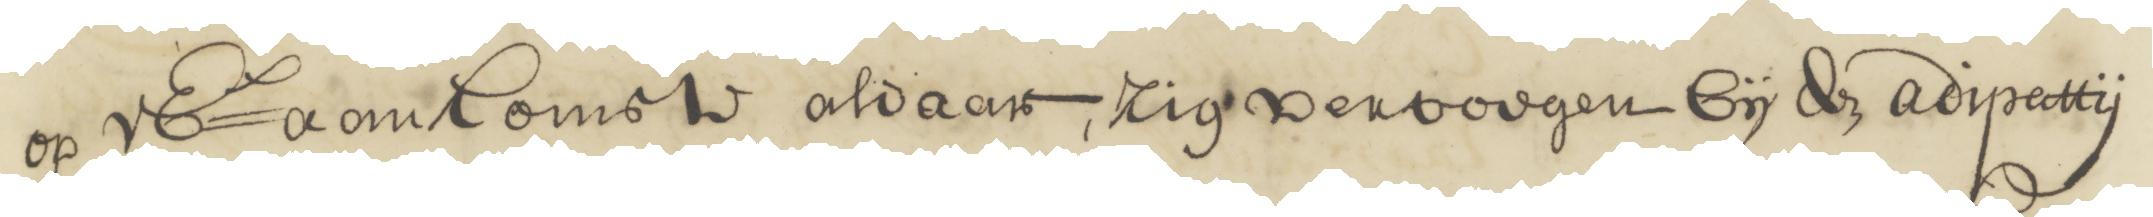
op VE=s aankomste aldaar, zig vervoegen bij den adipattij
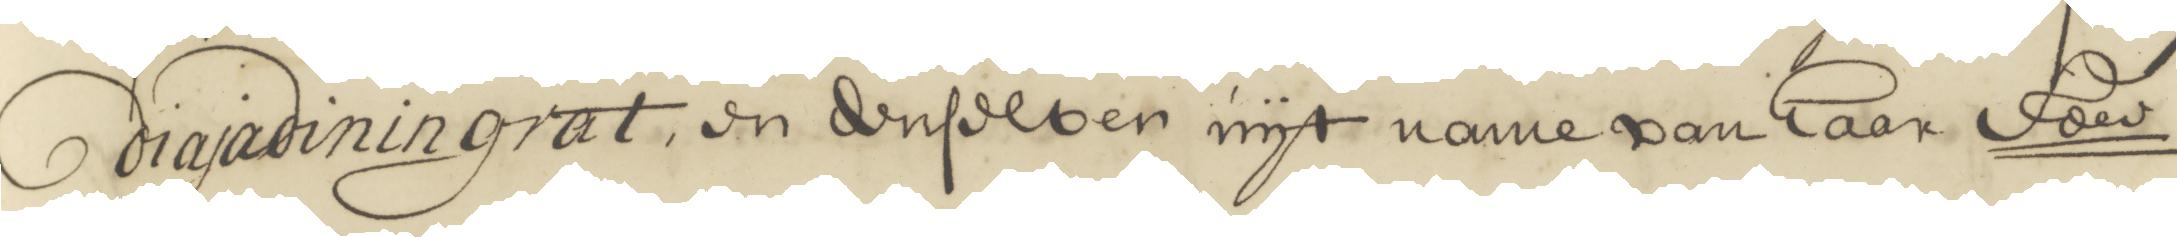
diajadiningrat, en denselver uijt name van haar Ed=le
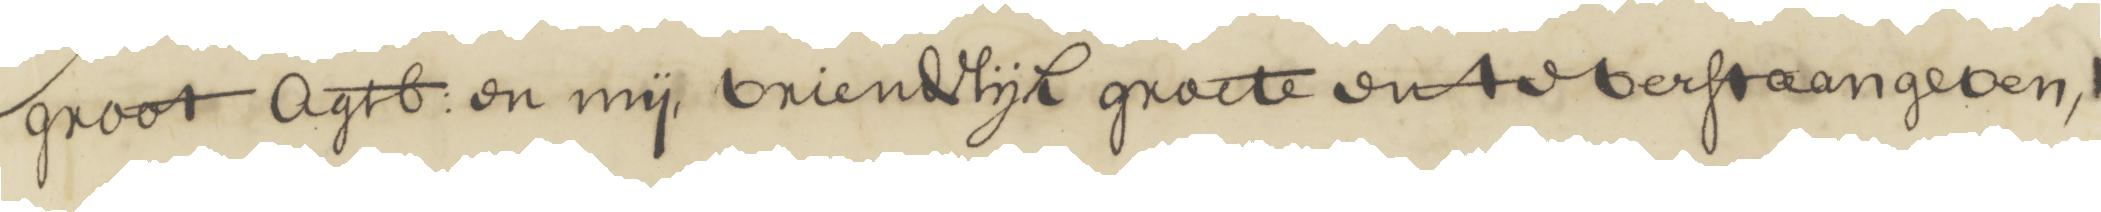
groot Agtb: en mij, vriendelijk groete en te verstaangeven,
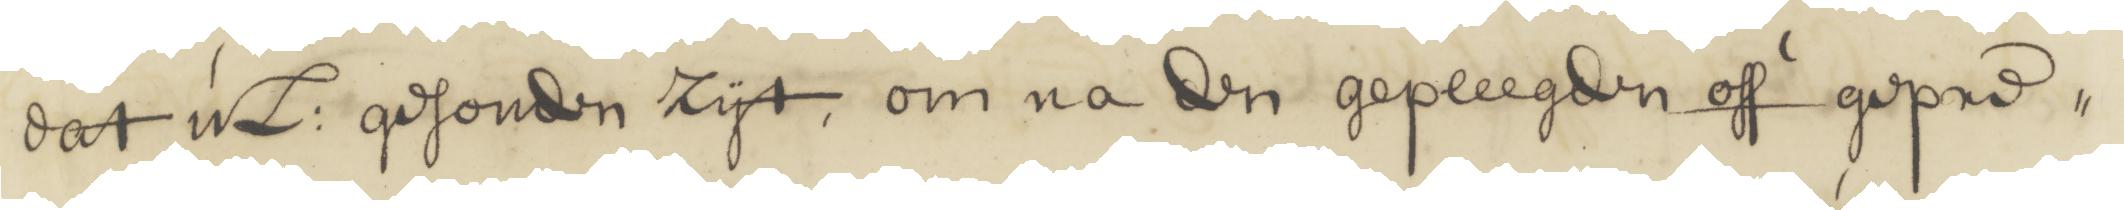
dat uL: gesonden zijt, om na den gepleegden off gepre„
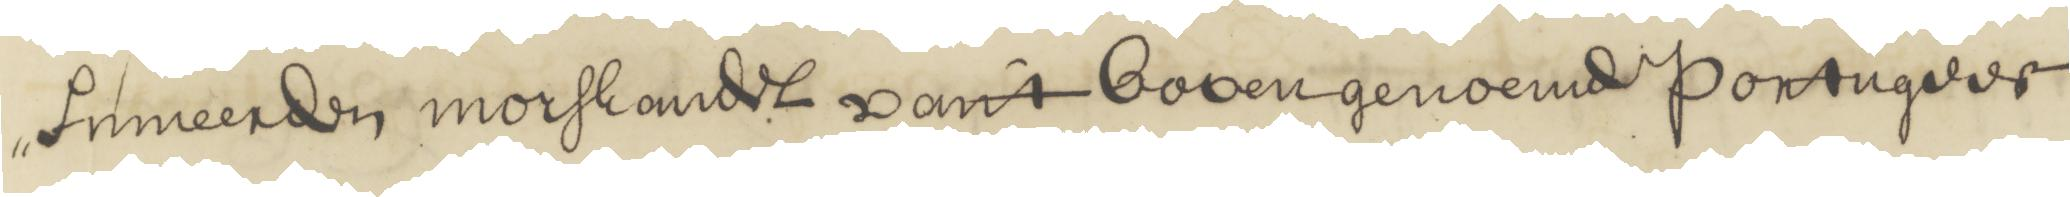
„sumeerden morshandel van’t boven genoemde portugees
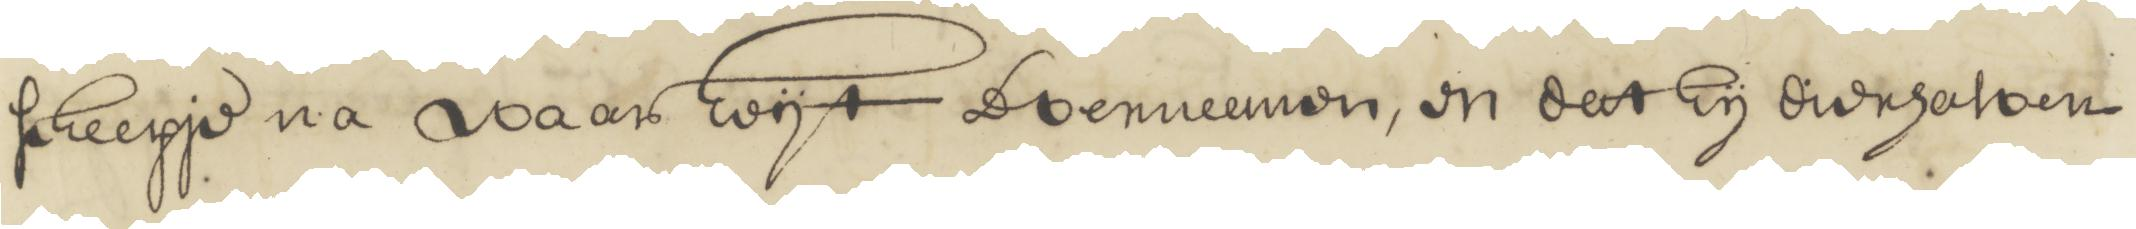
scheepje na waarheijt te verneemen, en dat hij dierhalven
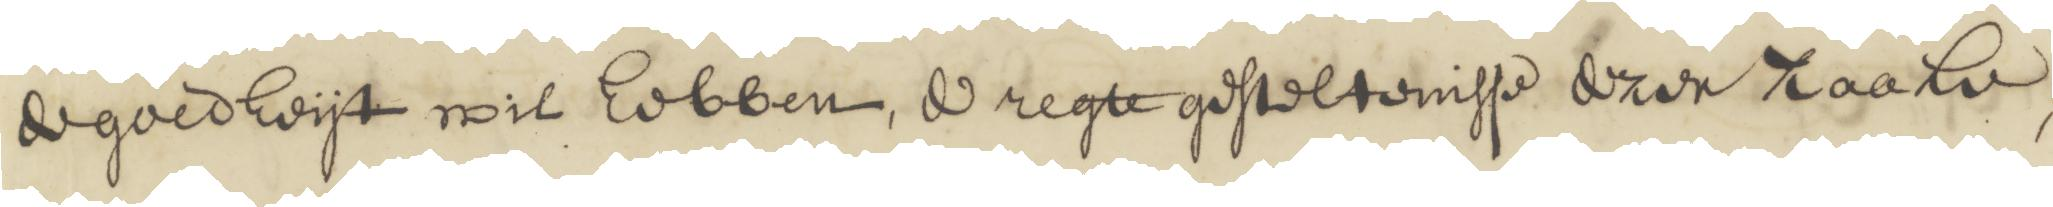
de goedheijt wil hebben, de regte gesteltenisse dezer zaake
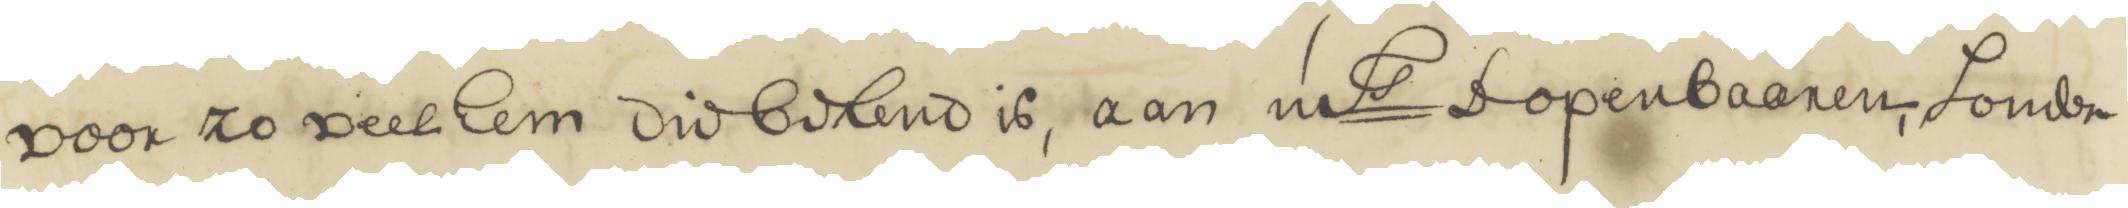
voor zo veel hem die bekend is, aan uE=s te openbaaren, sonder
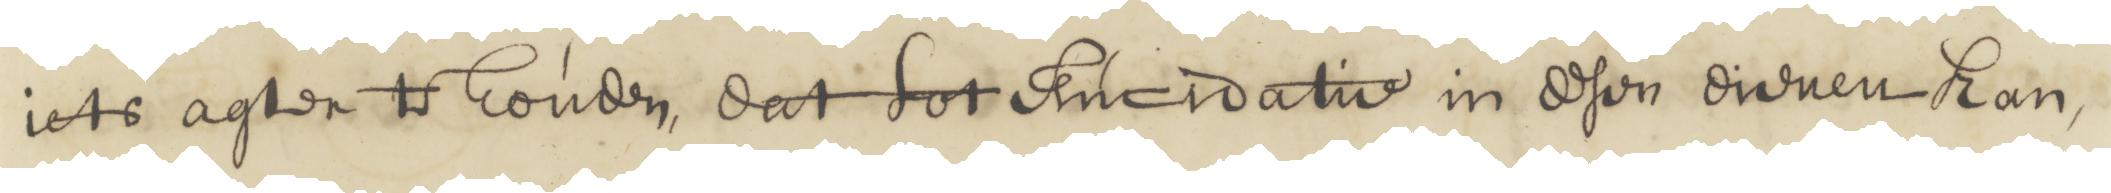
iets agter te houden, dat tot Elucidatie in desen dienen kan,
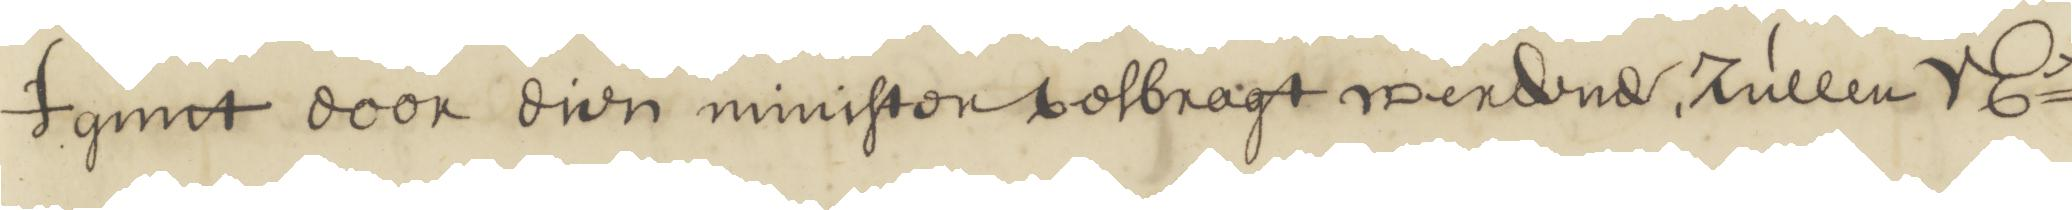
't gunt door dien minister volbragt werdende, zullen VE
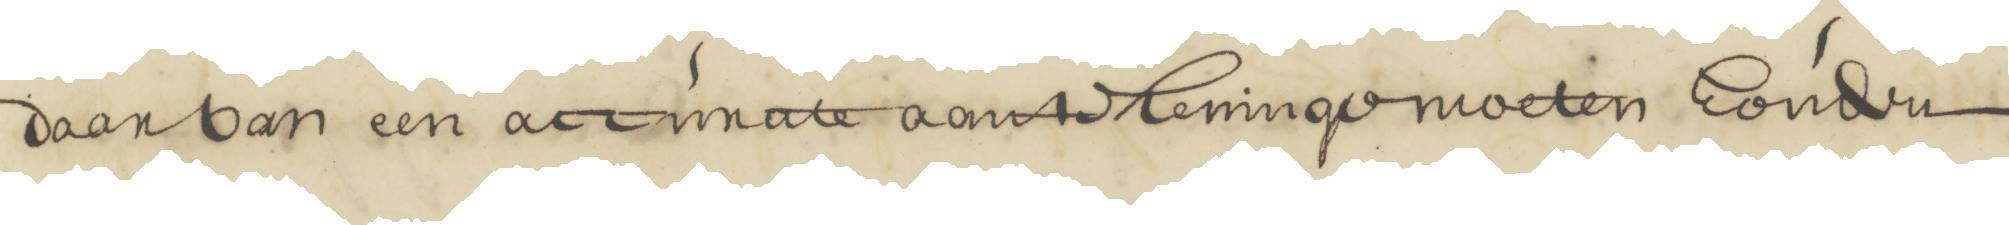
daar van een accurate aantekeninge moeten houden
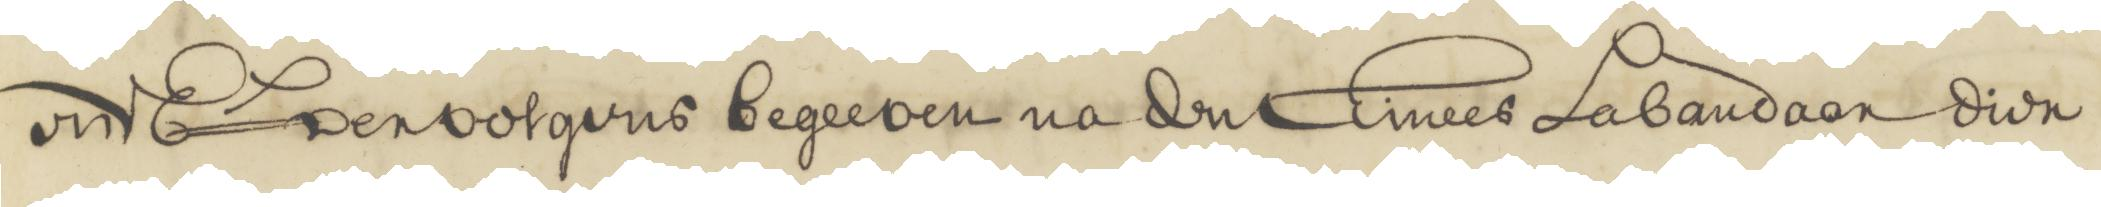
en VE=s vervolgens begeeven na den chinees sabandaar dier
